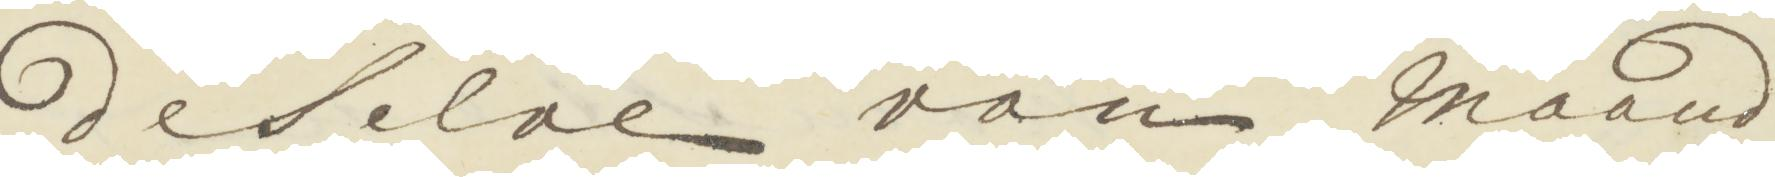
deselve van maand
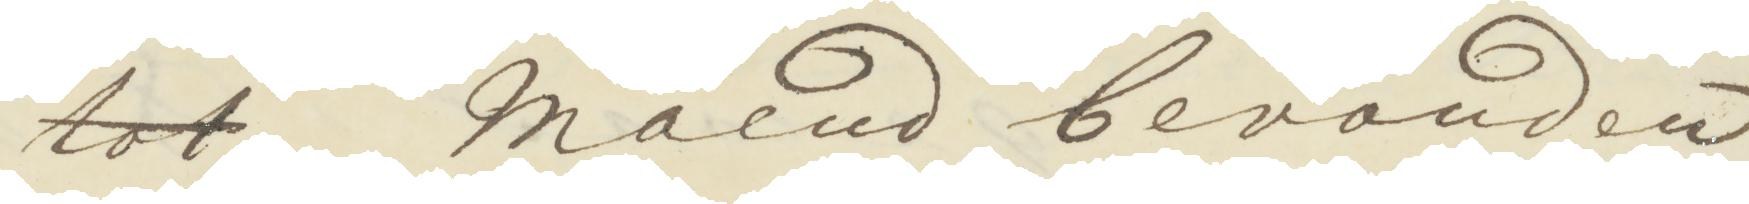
tot maend bevonden
